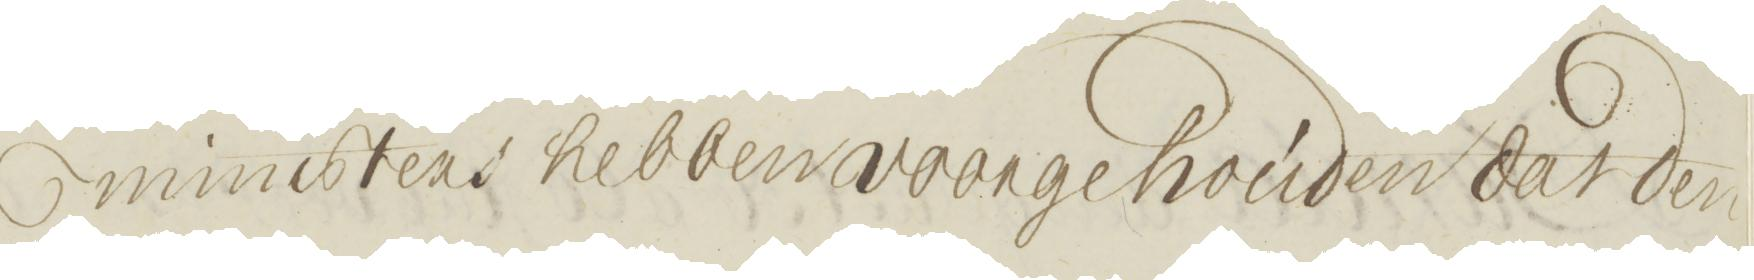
ministers hebben voor gehouden dat den
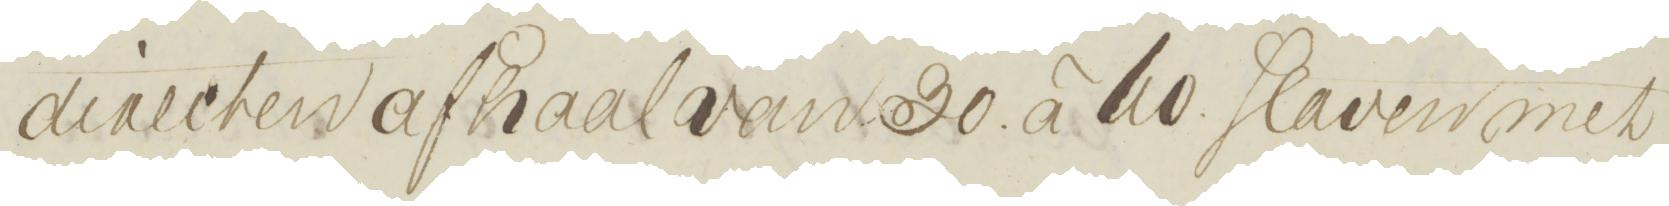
directen afhaal van 30. a 40. slaven met
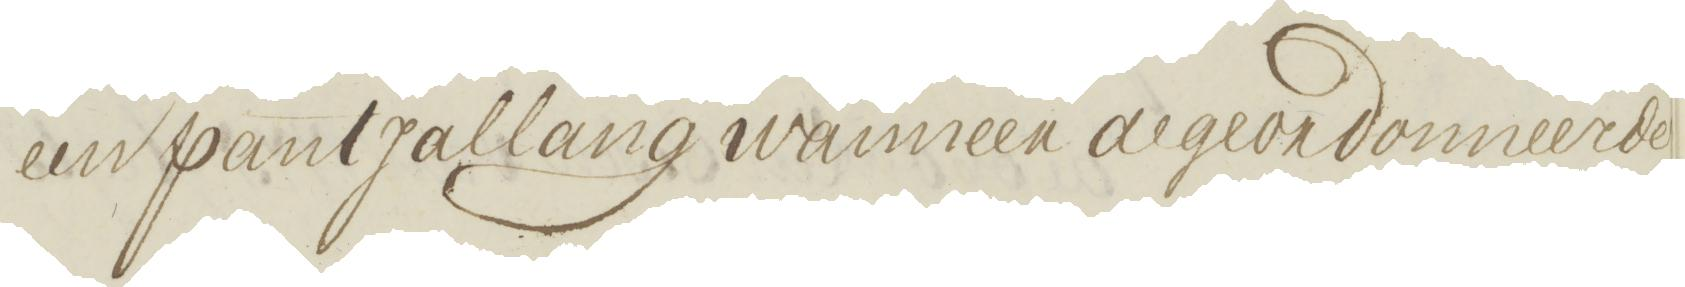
een pantjallang wanneer de geordonneerde
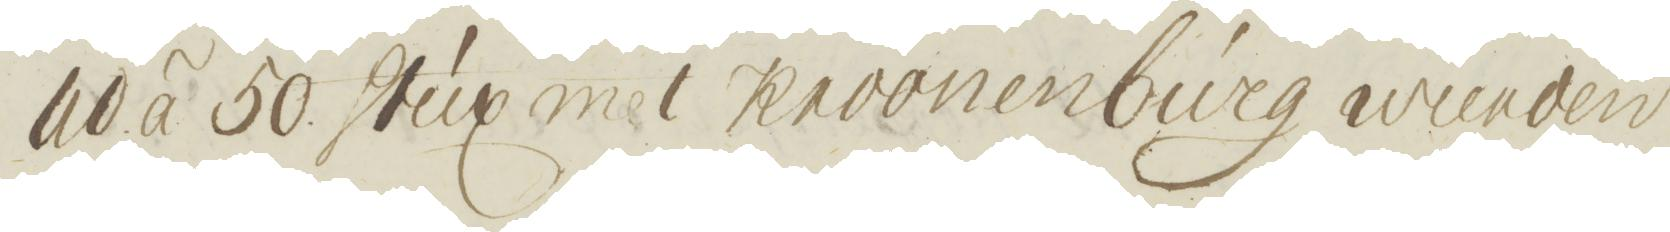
40. a 50. stux met kroonenburg wierden
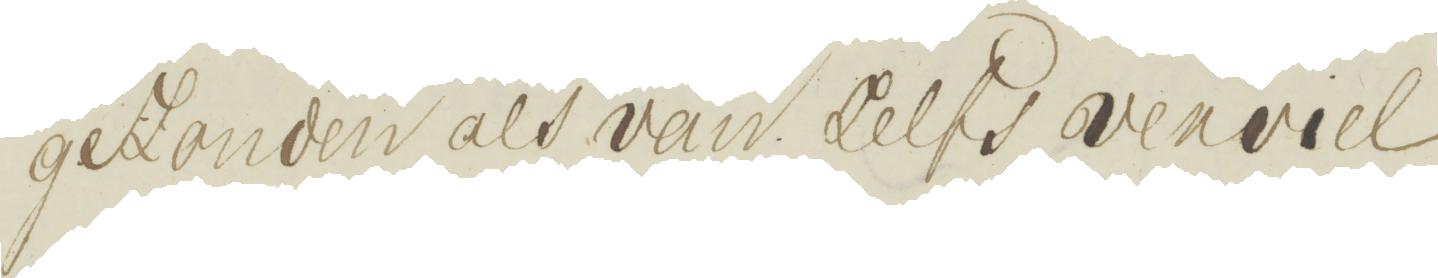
gezonden als van zelfs verviel
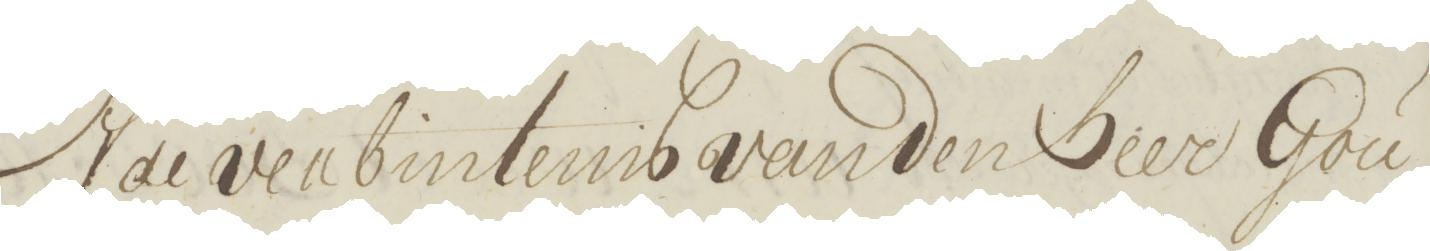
Of de verbintenis van den Heer Gou
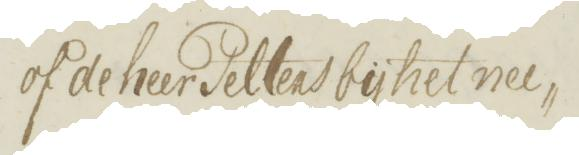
of de heer Pelters bij het nee„
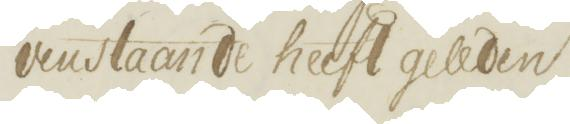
venstaande heeft geleden
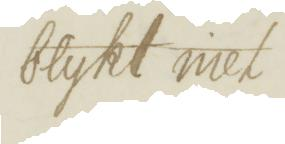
blykt niet
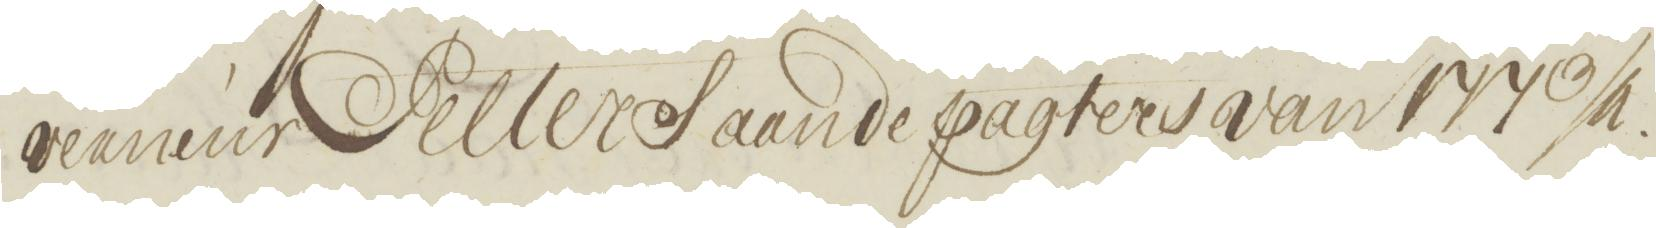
verneur Pelters aan de pagters van 1770/4.
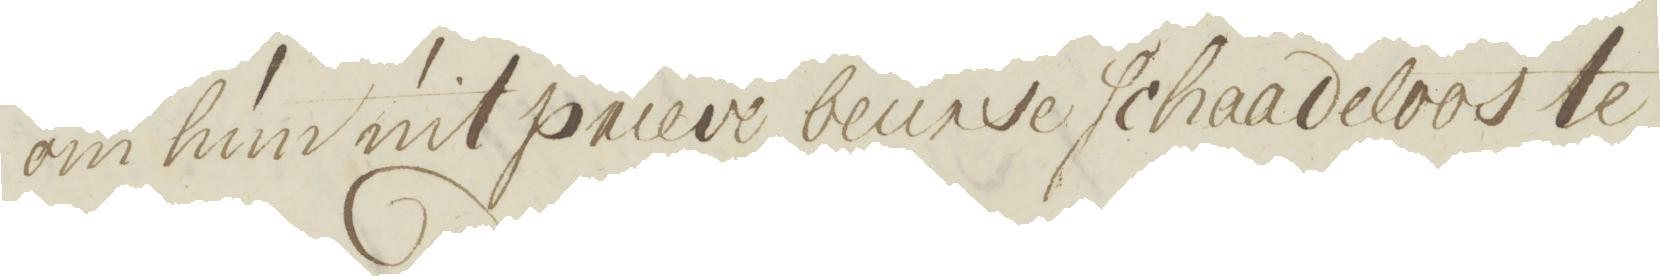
om hun uit prieve beurse schaadeloos te
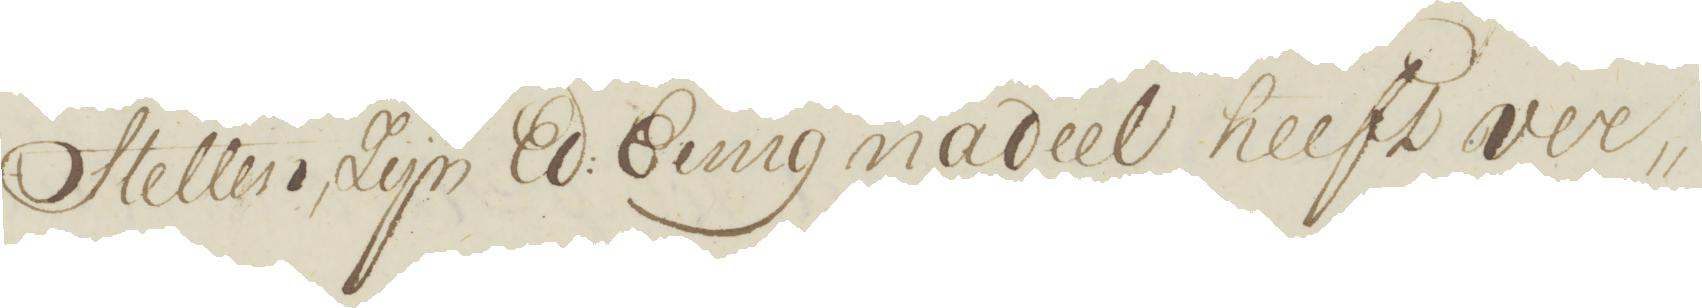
stellen, zijn Ed: Eenig nadeel heeft ver„
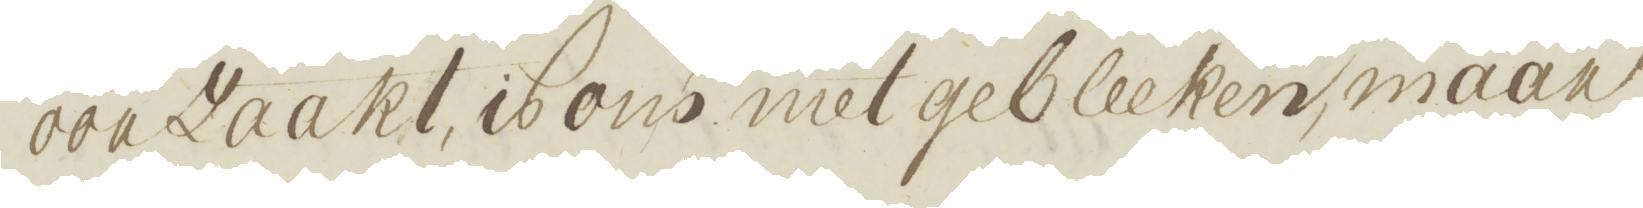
oorzaakt, is ons niet gebleeken, maar
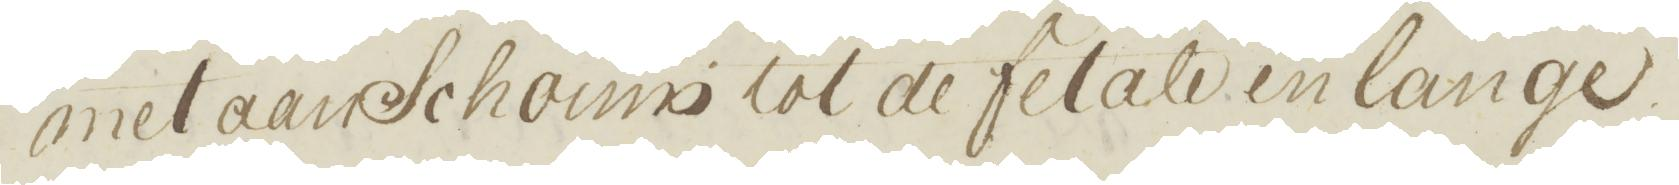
met aan schouw tot de fetale en lange
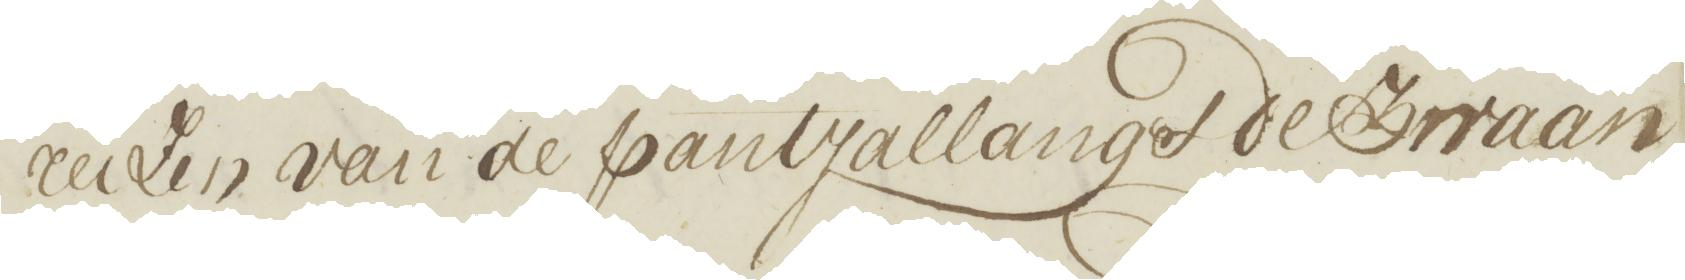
reizen van de pantjallangs de Zwaan
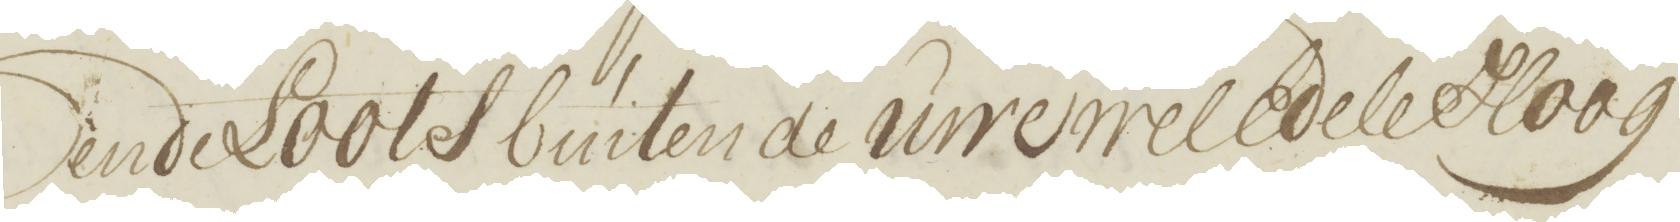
ende Loots buiten de uwe wel Edele Hoog
